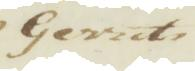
Gerrit
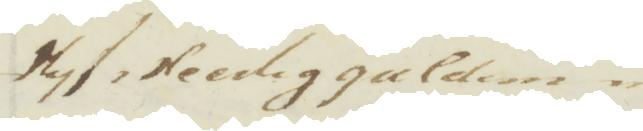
Vyf & veertig guldens .
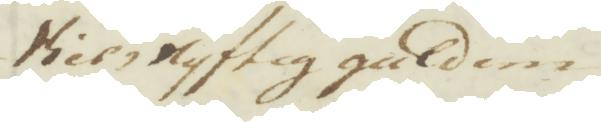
Vier & vyftig guldens
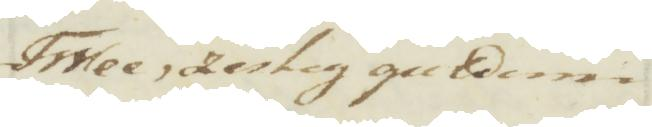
Twee & zestig guldens.
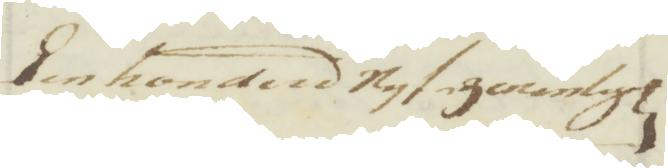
Een honderd vyf & zeventig
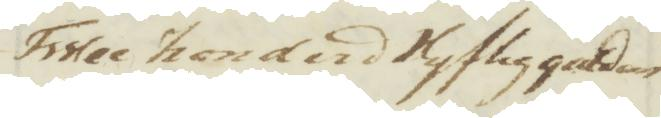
Twee honderd Vyftig gulden
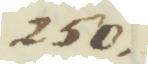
250.
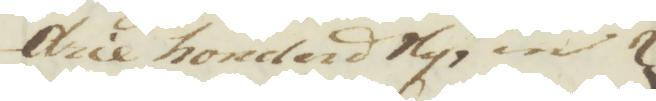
drie honderd Vyf en
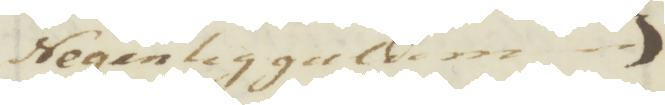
Negentig guldens
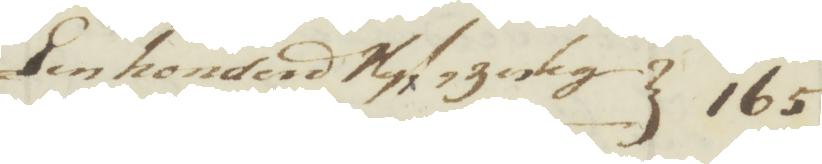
Een honderd Vyf & zestig 165
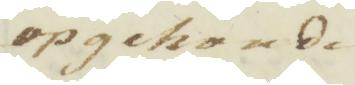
opgehoude
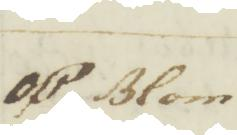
OP Blom
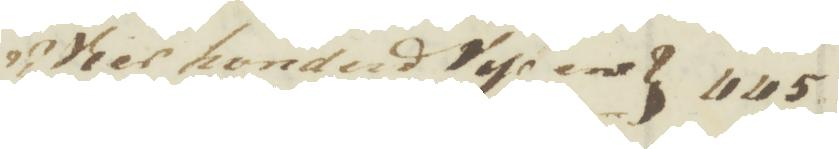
Vier honderd Vyf en 445
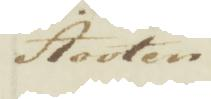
stooten
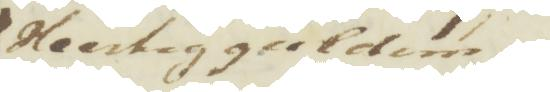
Veertig guldens
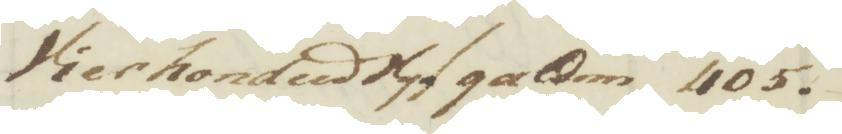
Vier honderd Vyf gulden 405.
